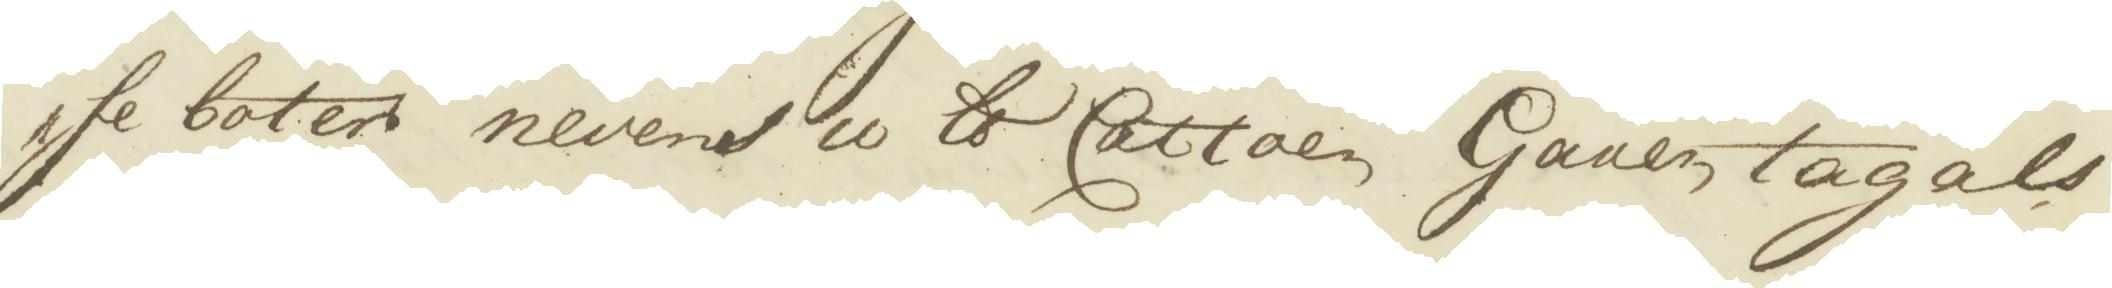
„se boten nevens 10 lb Cattoen Garen tagals
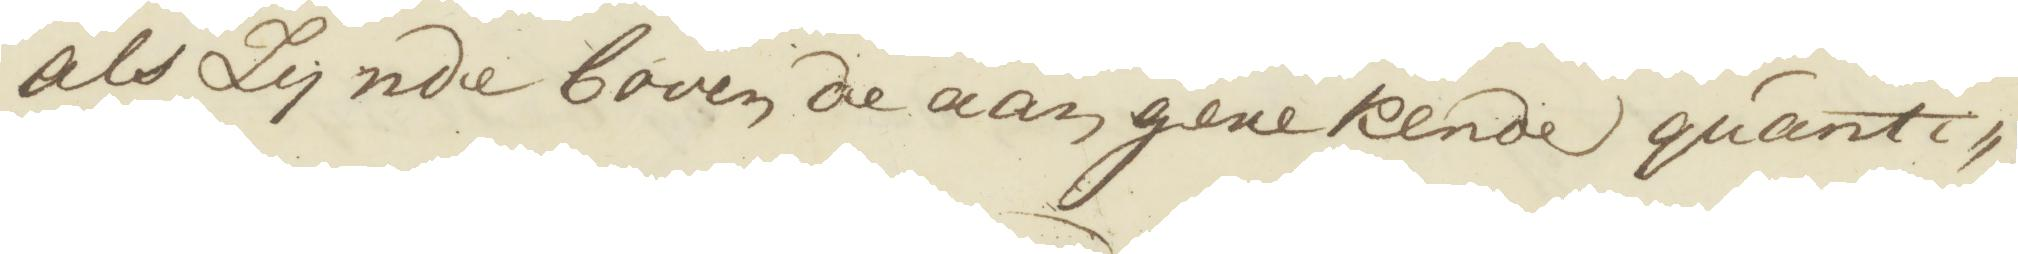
als zijnde boven de aan gerekende quanti„
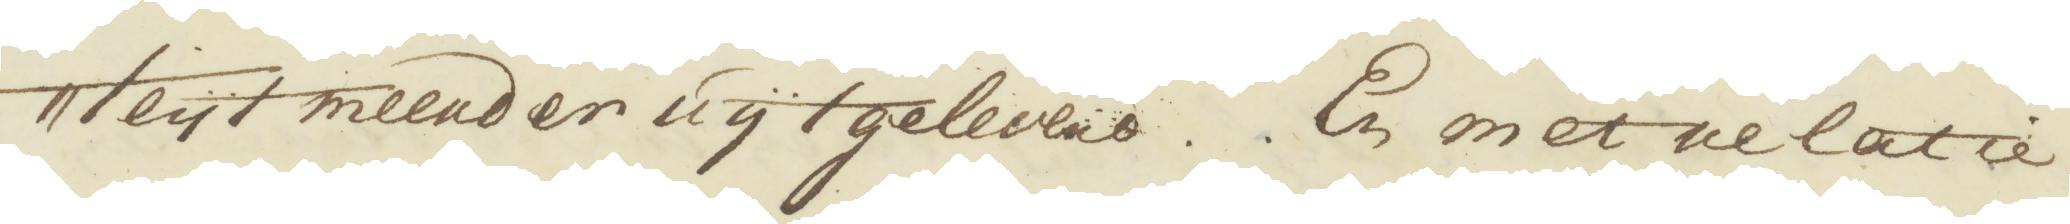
„teijt meerder uijtgeleverd. En met relatie
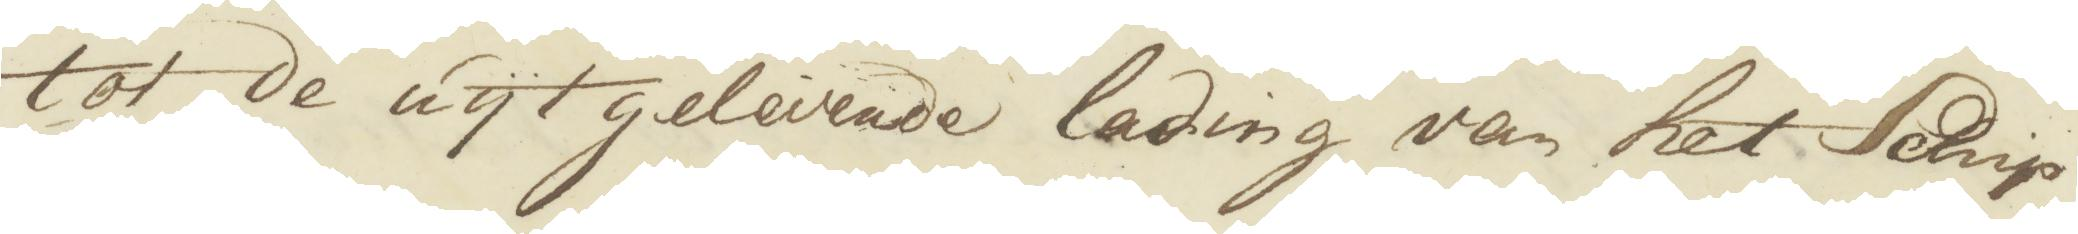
tot de uijt geleverde lading van het schip
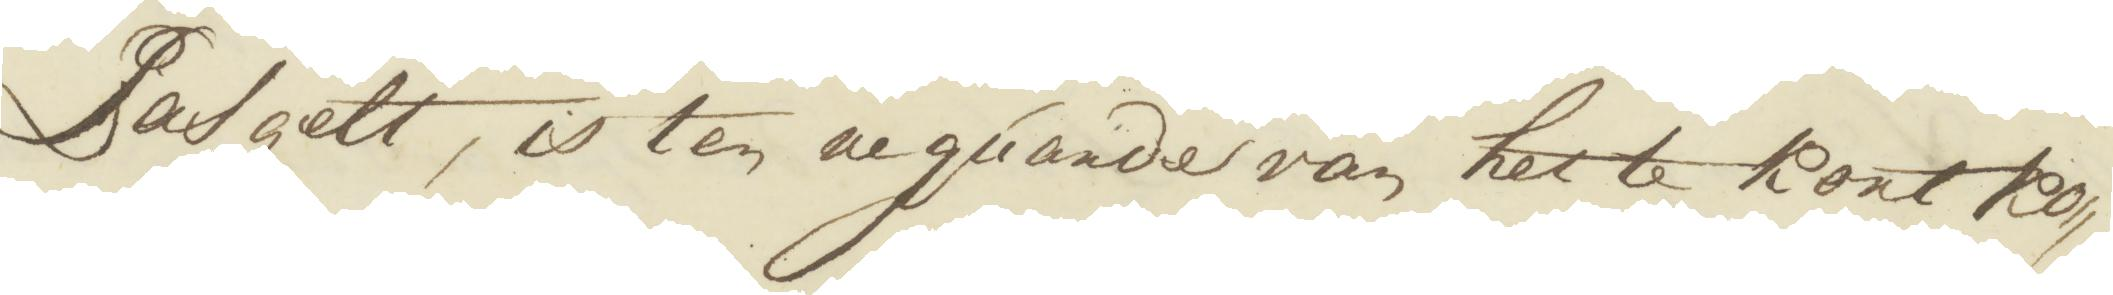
Pasgelt, is ten requarde van het te kort ko„
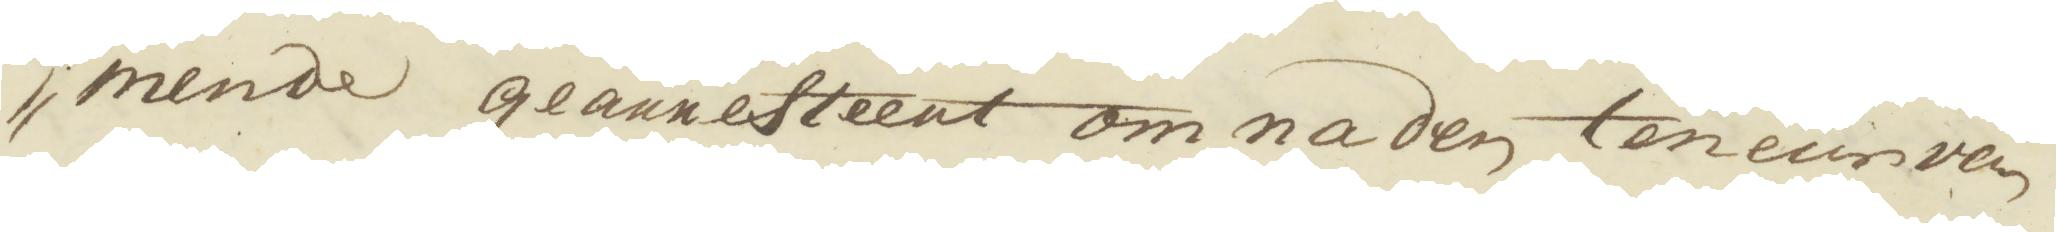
„mende gearresteert om na den teneur van
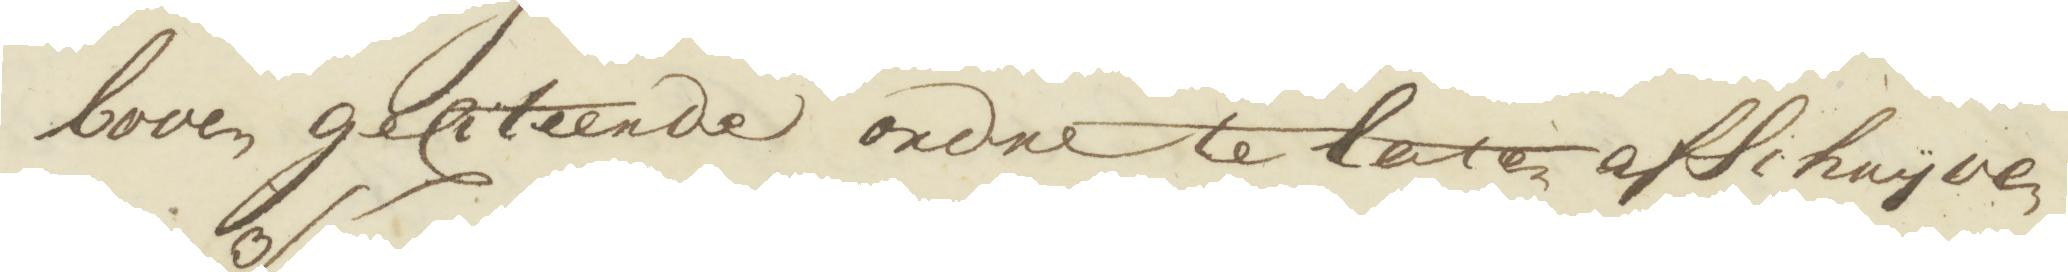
boven geciteerde ordre te laten afschrijven
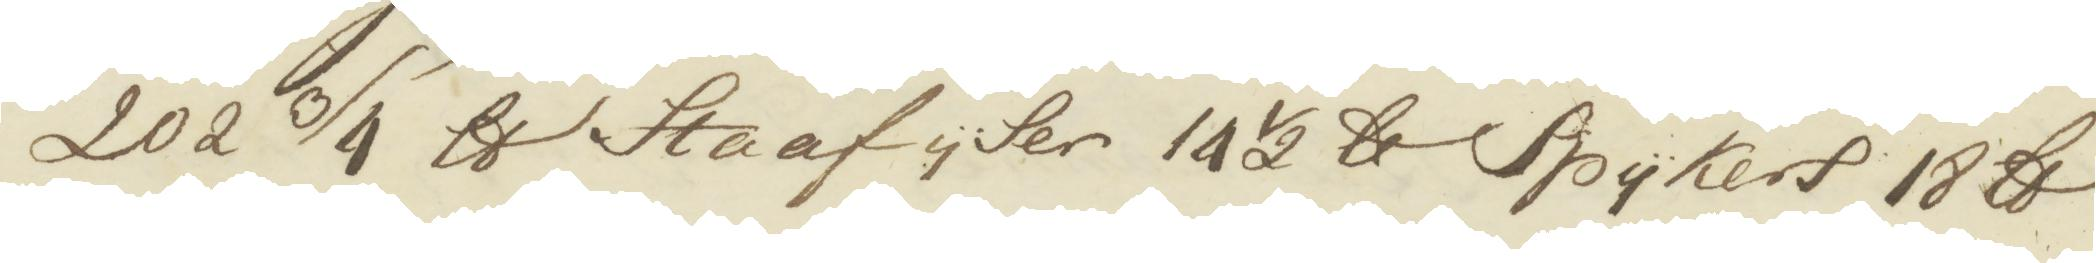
202¾ lb staaf ijser 14½ lb spijkers 18 lb
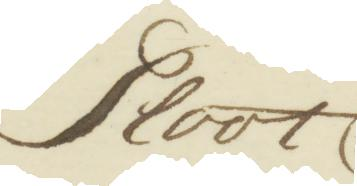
sloot
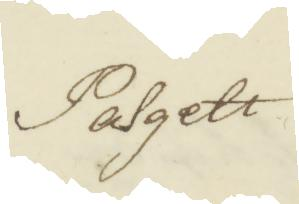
Pasgelt
